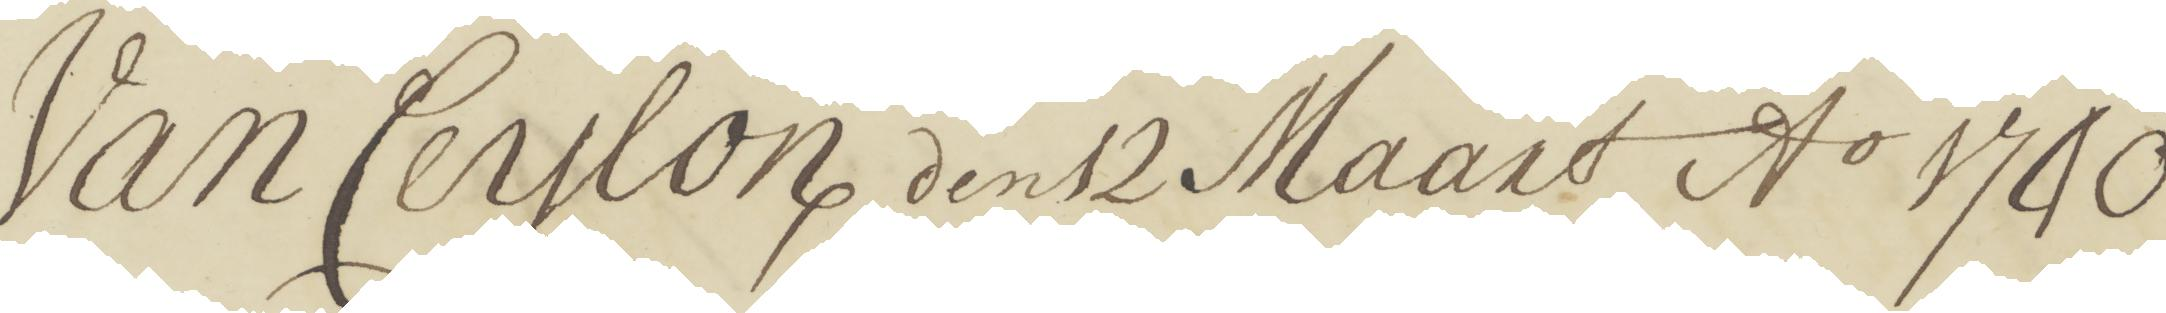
Van Ceylon den 12 Maart Ao 1740
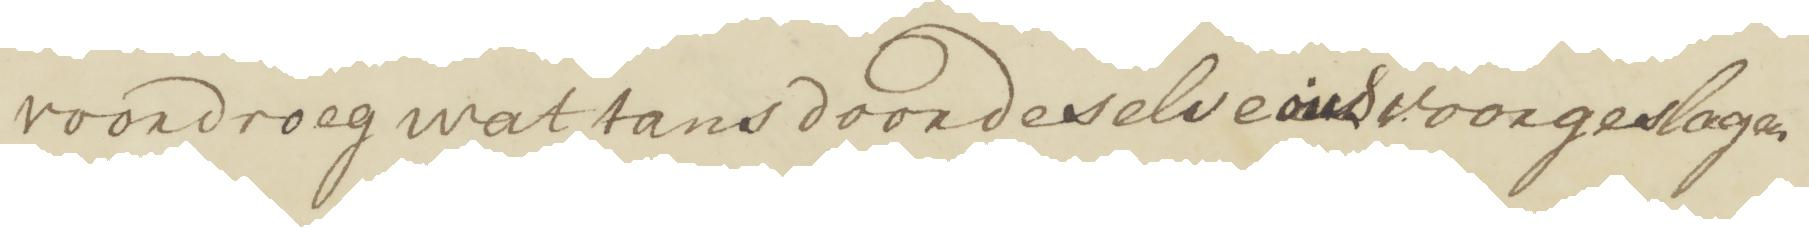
voordroeg wat tans door deselve ons voorgeslagen
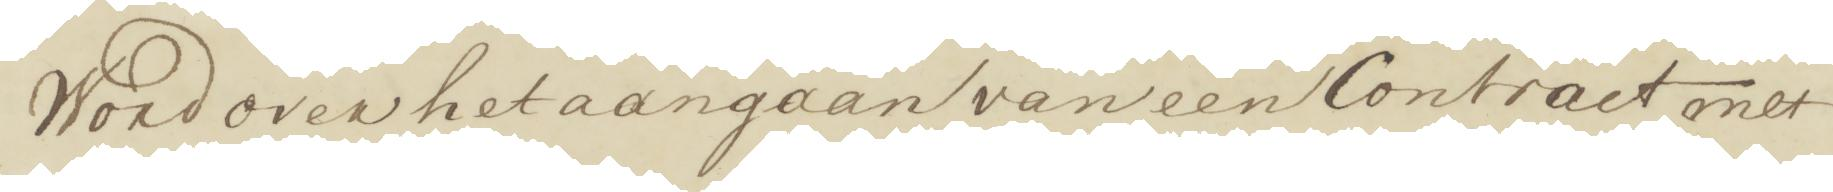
Word over het aangaan van een Contract met
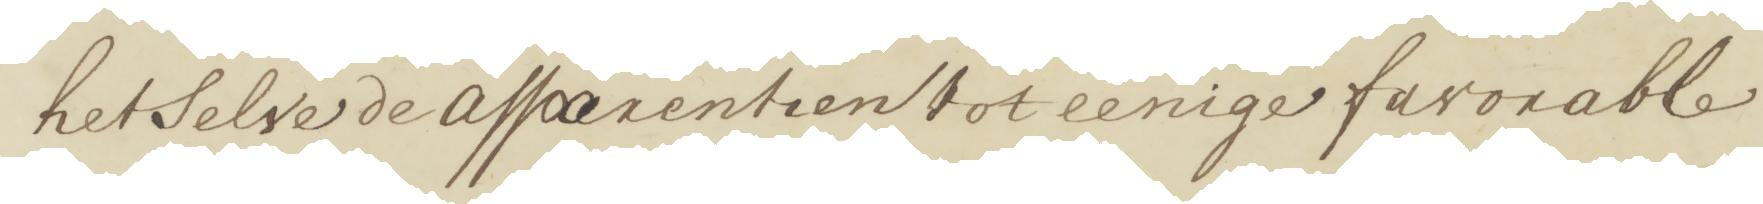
hetselve de apparentien tot eenige favorable
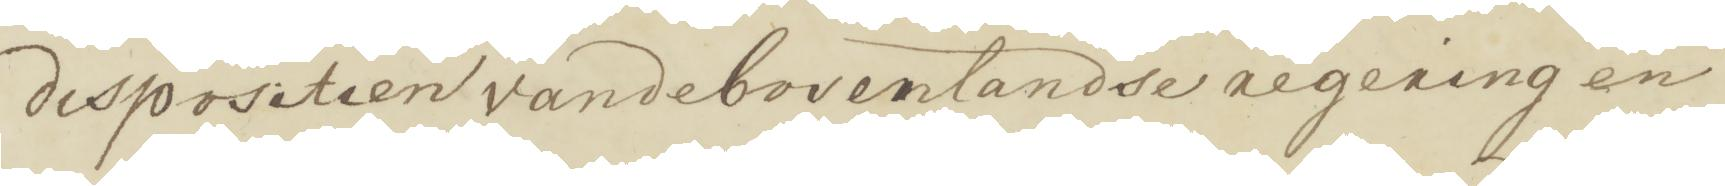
dispositien van de bovenlandse regering en
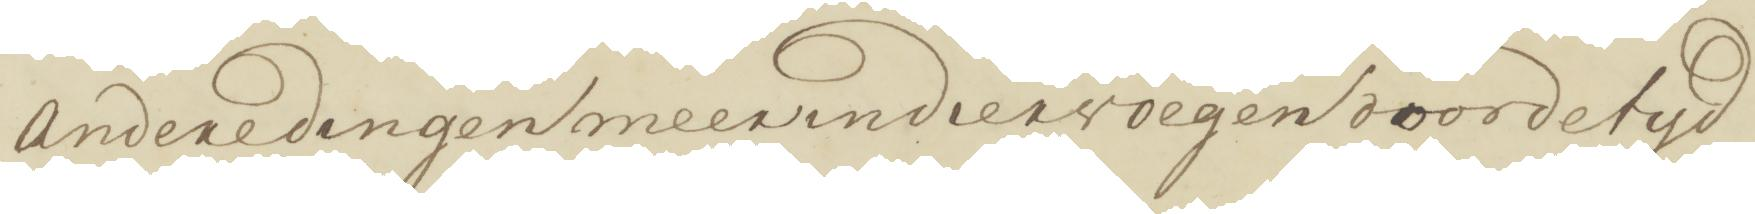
andere dingen meer indiervoegen door de tyd
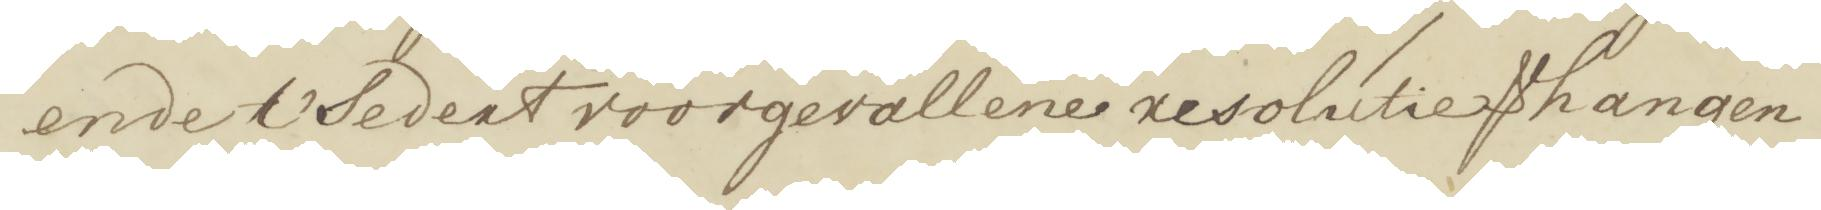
ende t'sedert voorgevallene resolutie verhangen
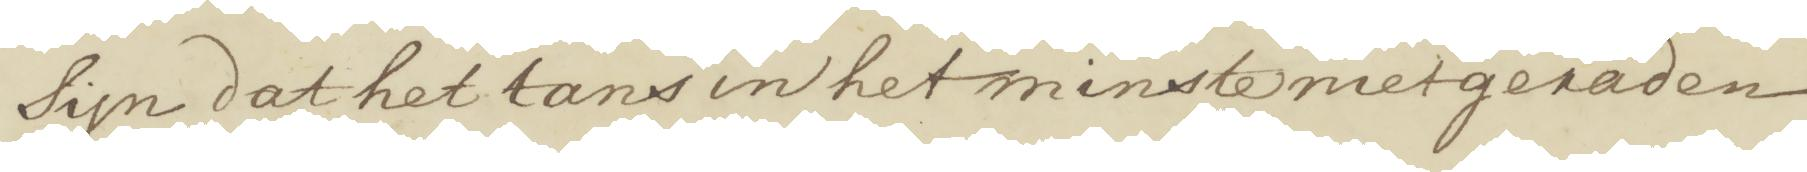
sijn dat het tans in het minste niet geraden
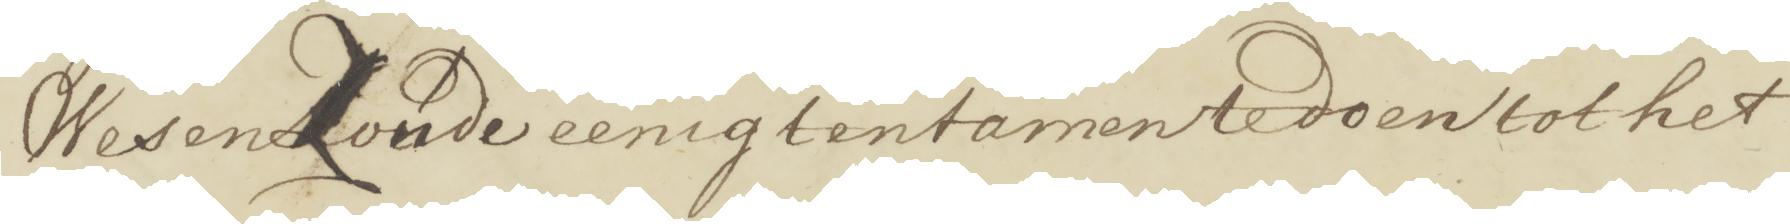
Wesen Zoude eenig tentamen te doen tot het
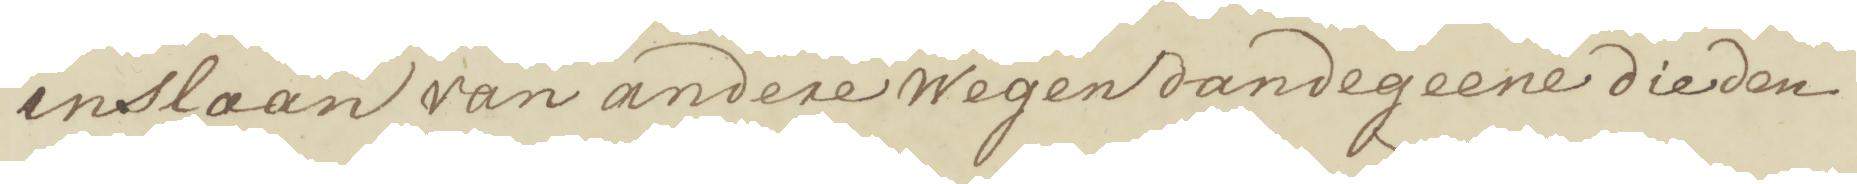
inslaan van andere wegen dan degeene die den
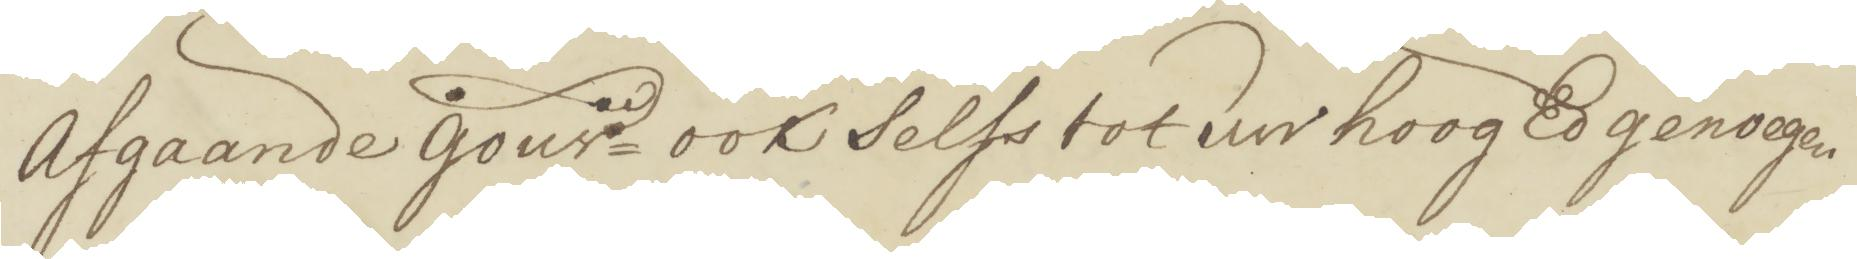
afgaande gouv=r ook selfs tot uw hoog Ed genoegen
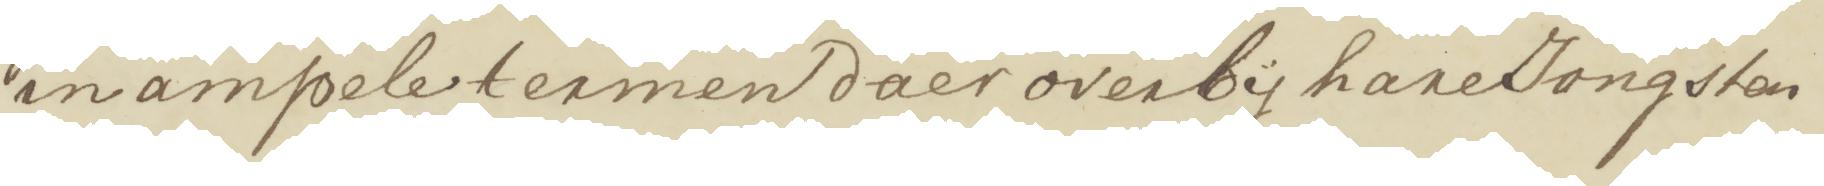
in ampele termen daer over bij hare Jongsten
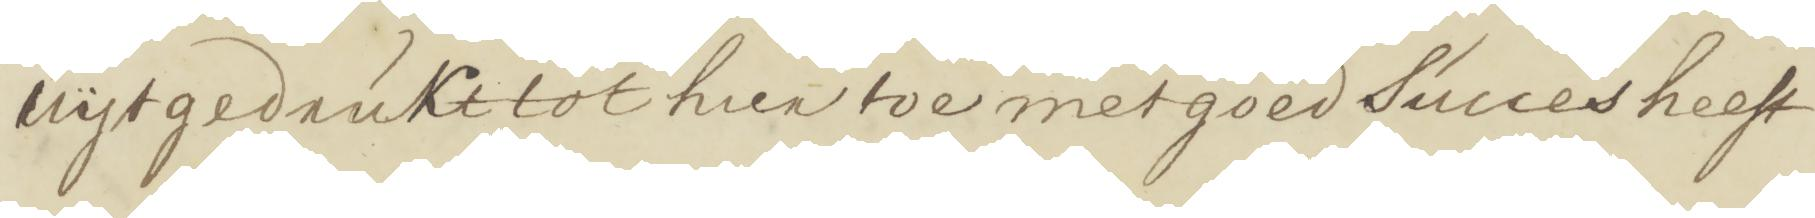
uijtgedrukt tot hier toe met goed succes heeft
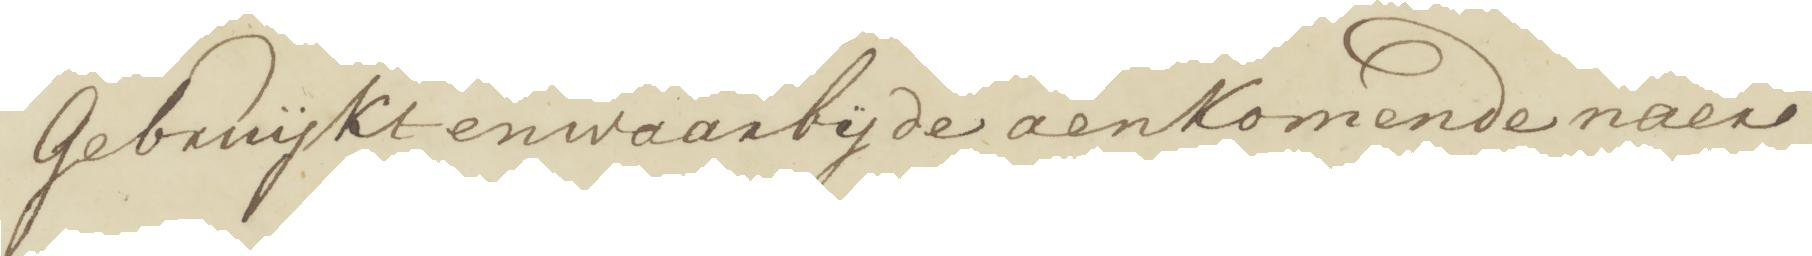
gebruijkt en waarbij de aenkomende naer
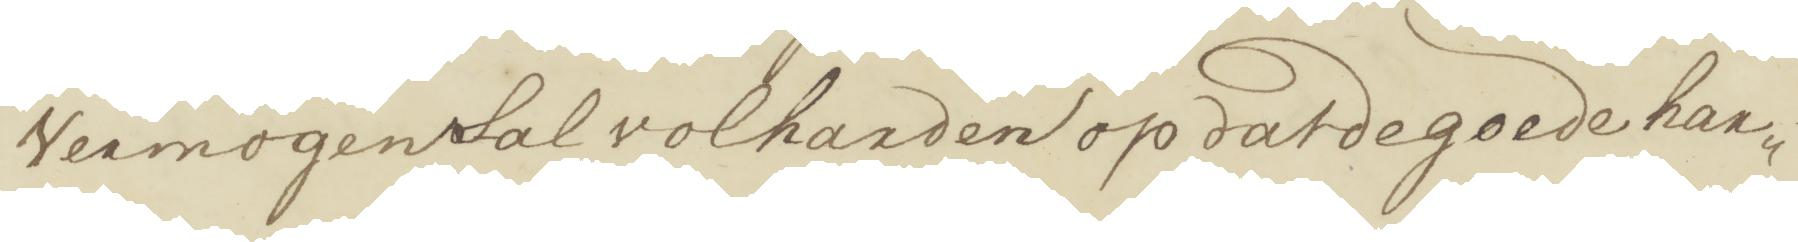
vermogen sal volharden op dat de goede har„
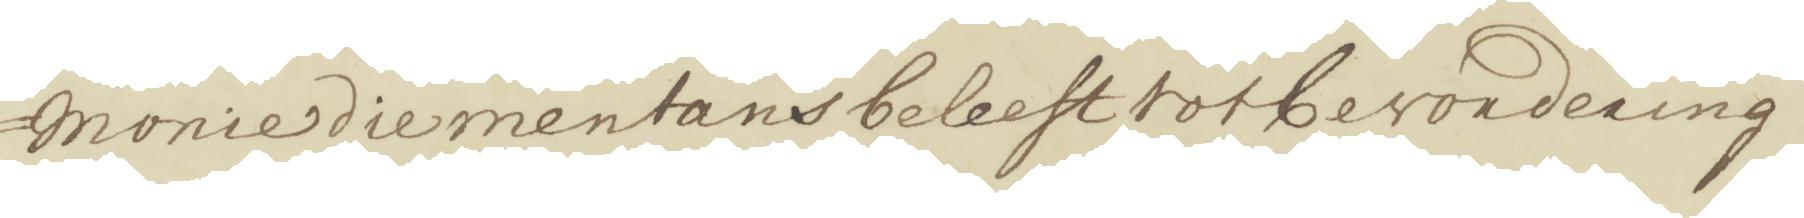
=monie die men tans beleeft tot bevordering
